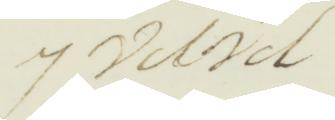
J VdVel
